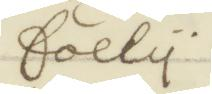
foelij
